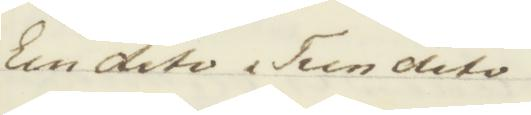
Een dito & Tien dito
